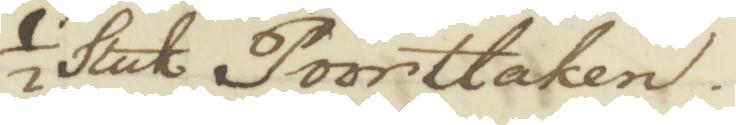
½ stuk Poortlaken
